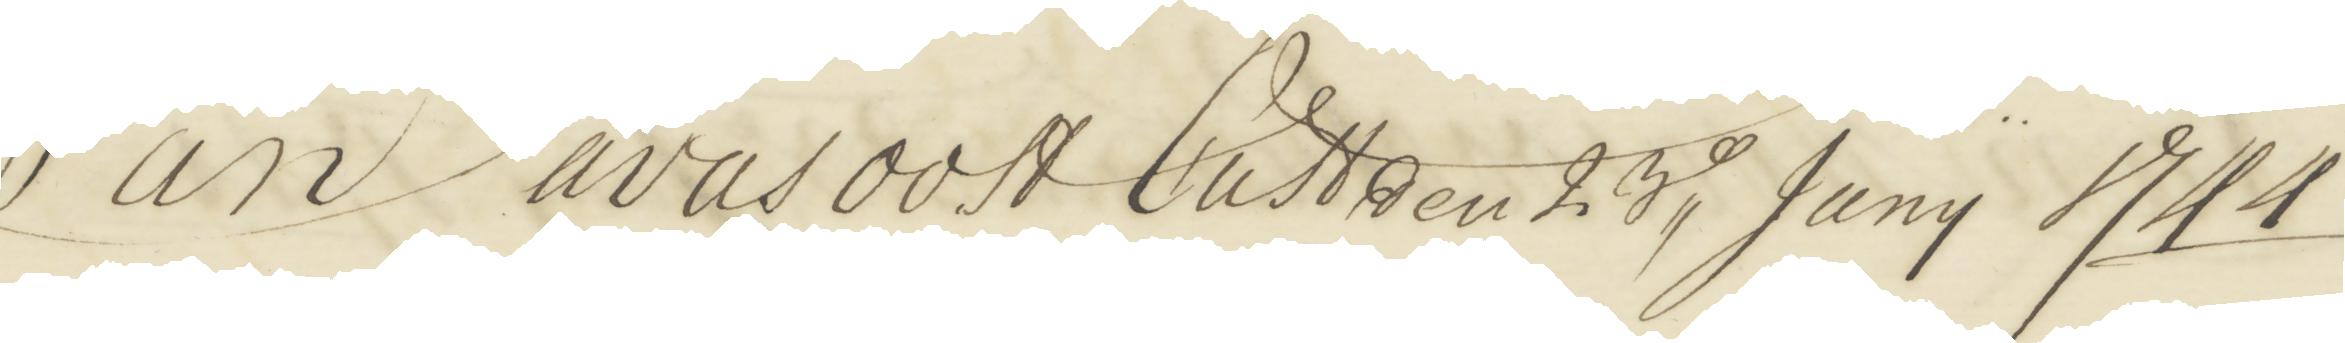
Van Javas oost Cust den 23„e Junij 1744
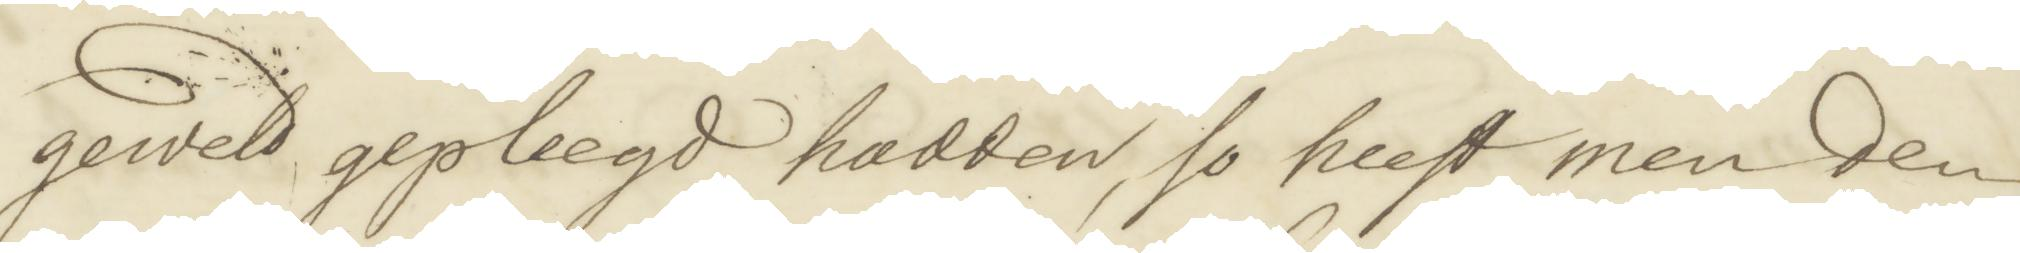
geweld gepleegd hadden, so heeft men den
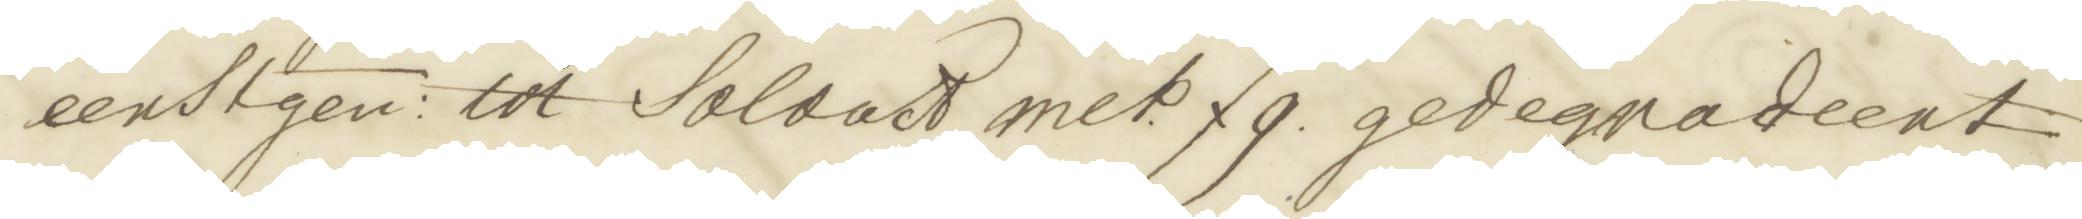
eerstgen: tot soldaet met ƒ9. gedegradeert
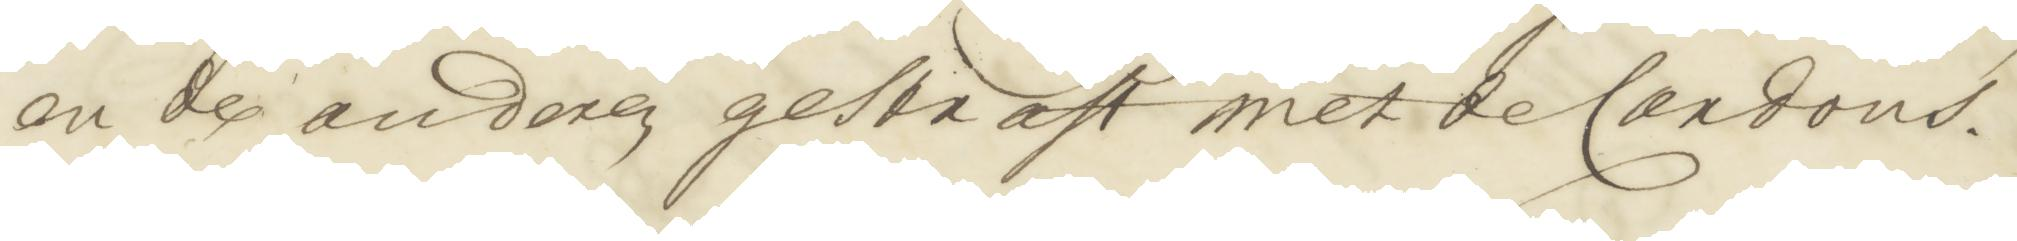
en de anderen gestraft met de Cordons.
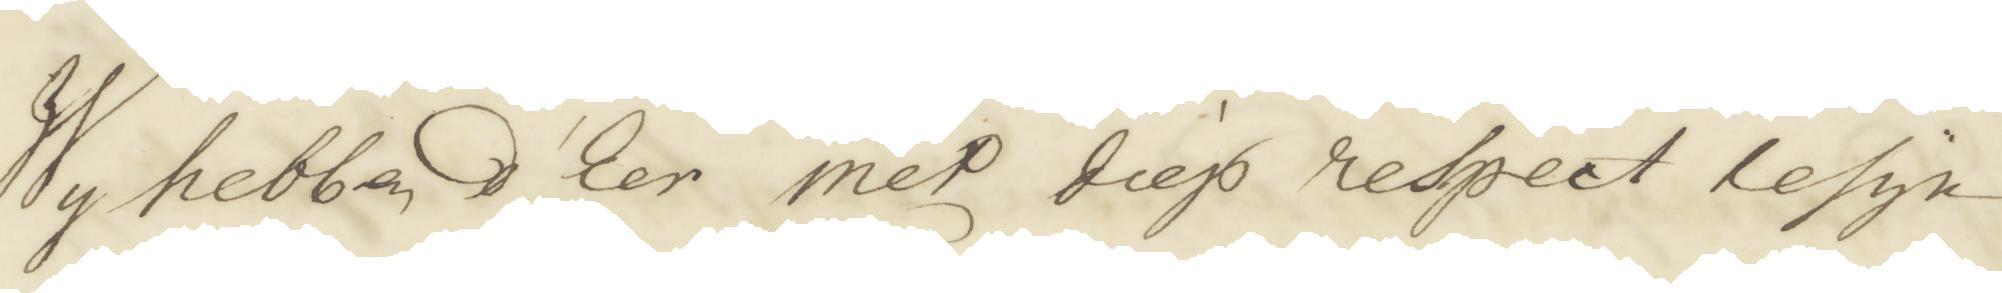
Wy hebben d’ Eer met diep respect te sijn
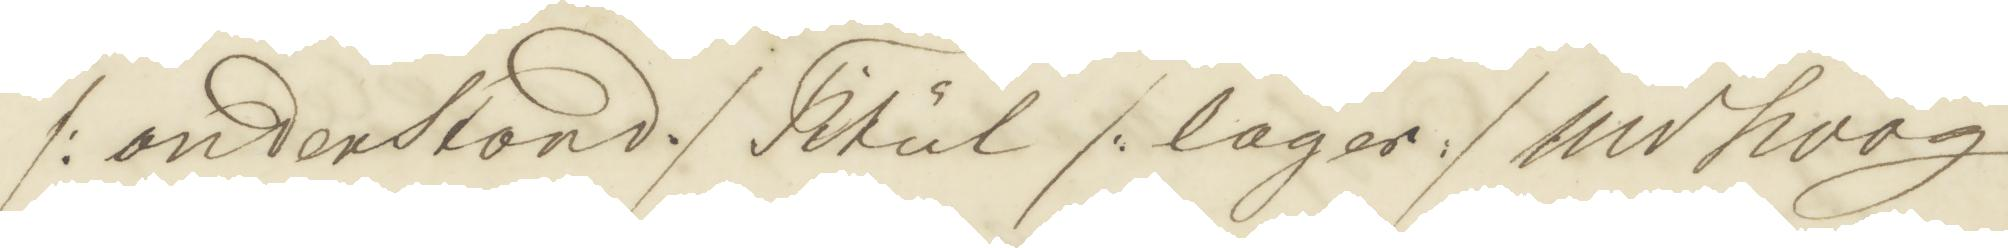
/:onderstond:/ Titul /:lager:/ uw hoog
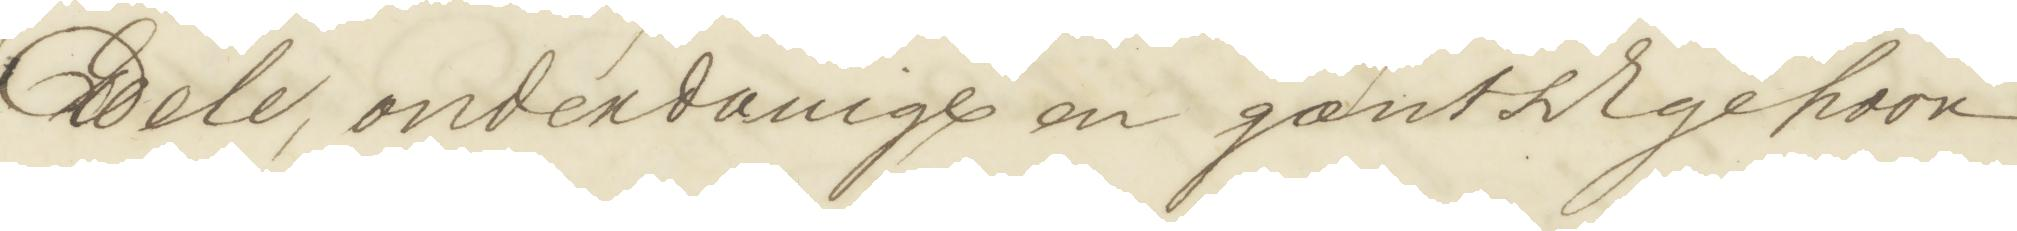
Edele, onderdanige en gantschgehoor
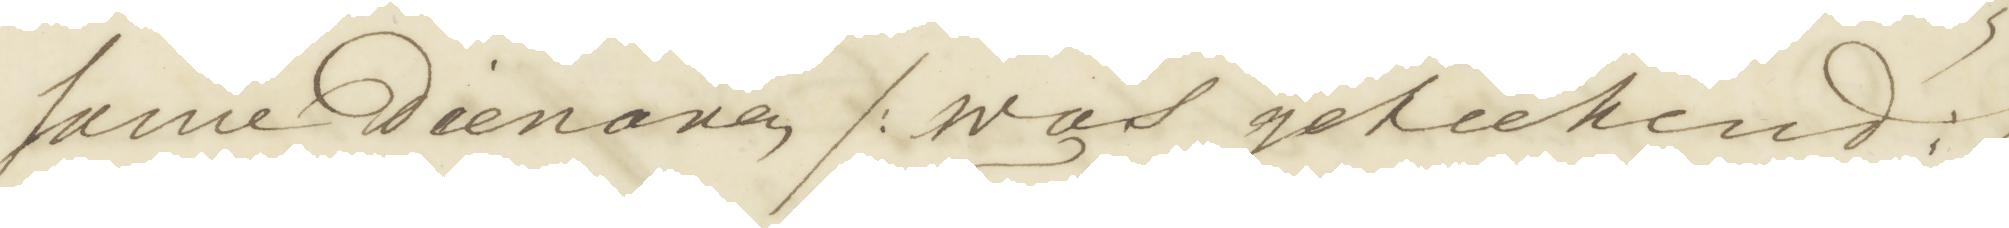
same dienaren /:was geteekend:/
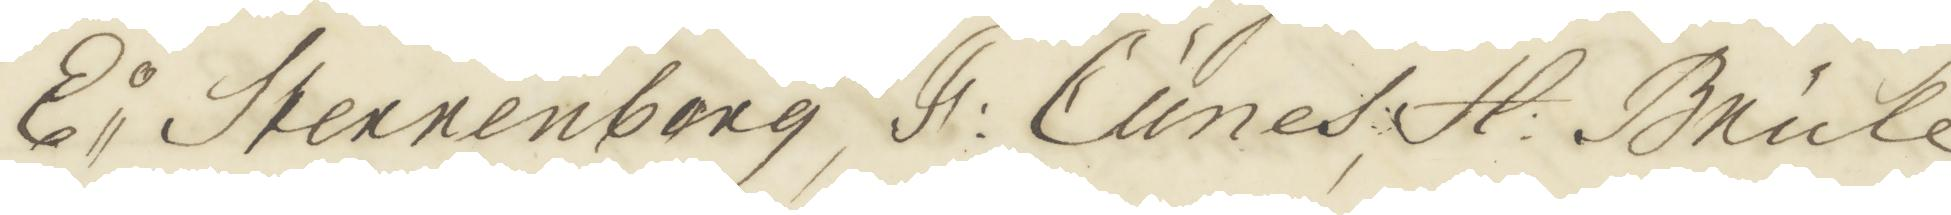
E„o Sterrenborg, F: Cunes, H: Brule
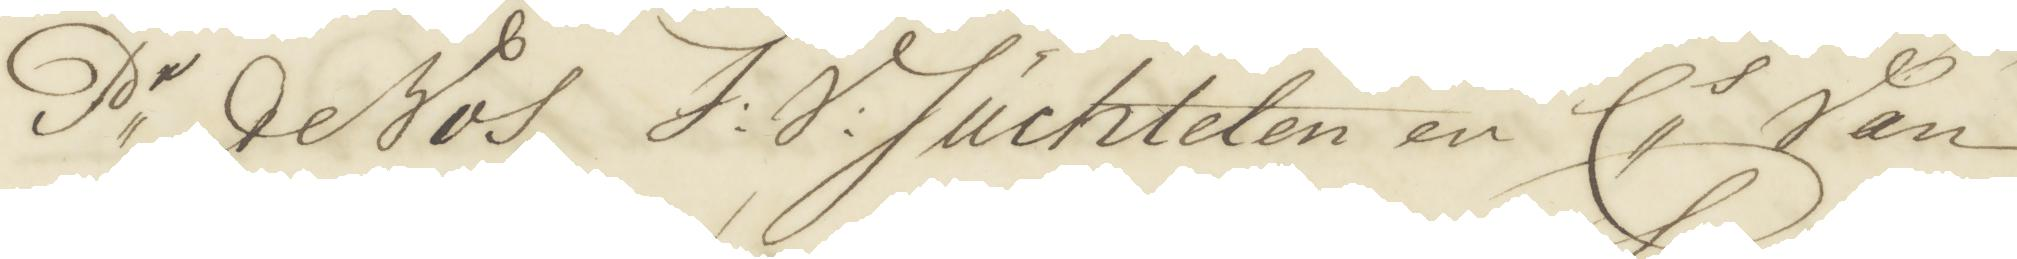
P„r de Vos, J: V: suchtelen en C„s Van
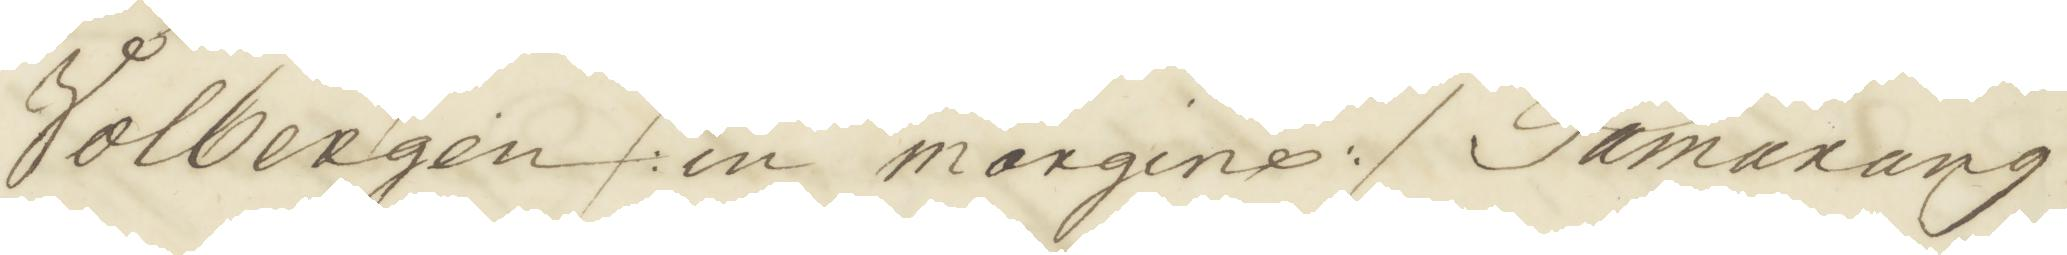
Volbergen /:in margine:/ Samarang
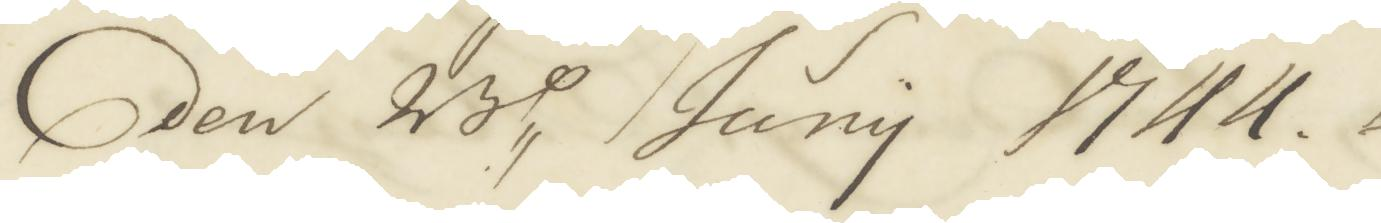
den 23„e Junij 1744.
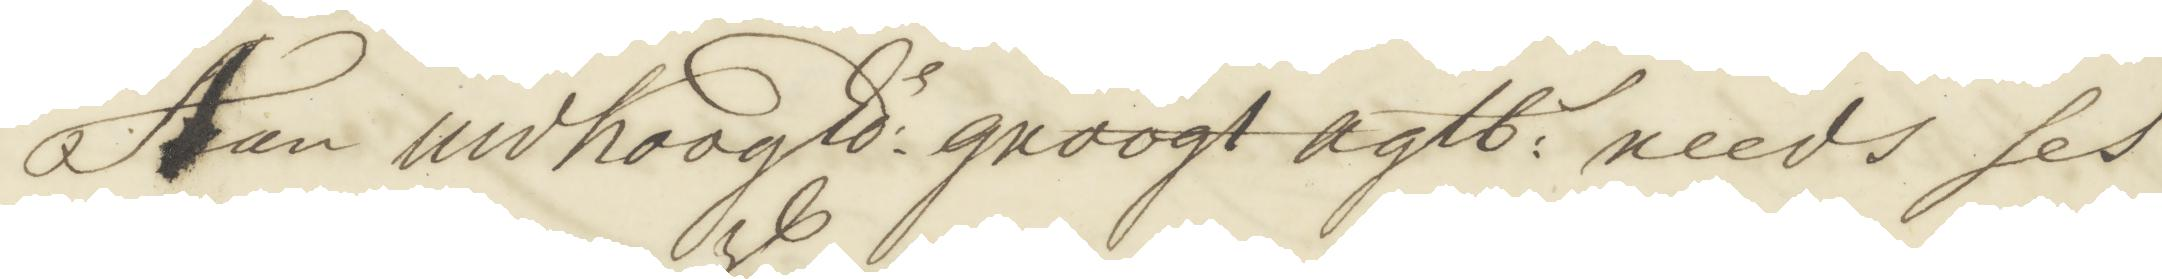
Aan uw hoog Ed:en groogt agtb:s reeds ses
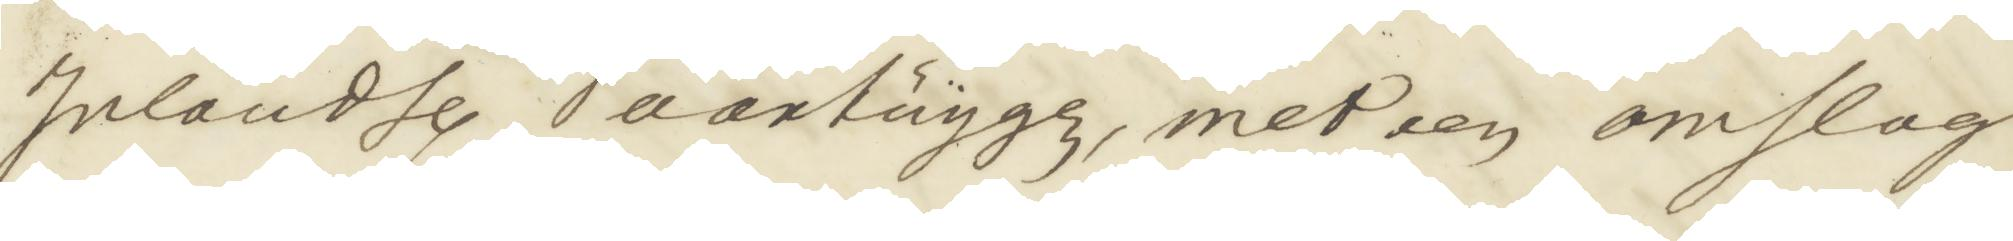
Jnlandse Vaartuijgen, met een omslag
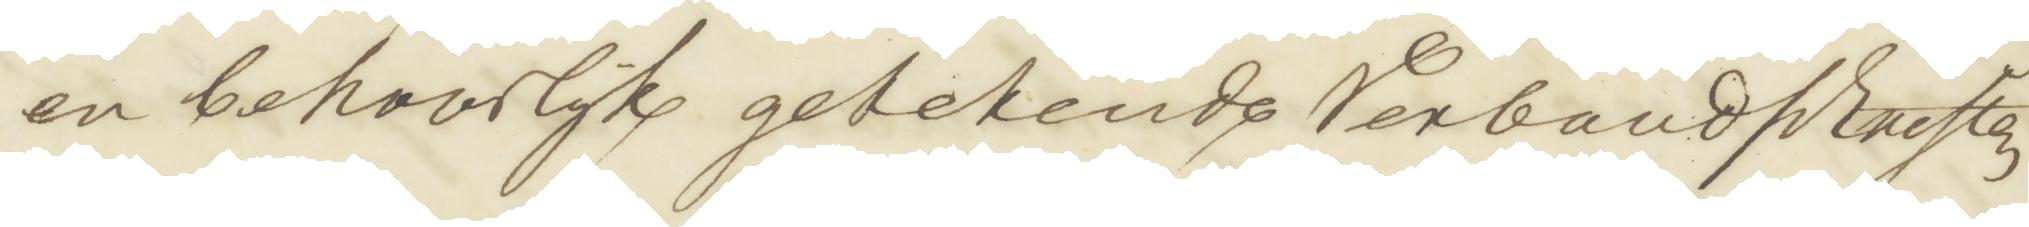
en behoorlijk getekende verbandschriften
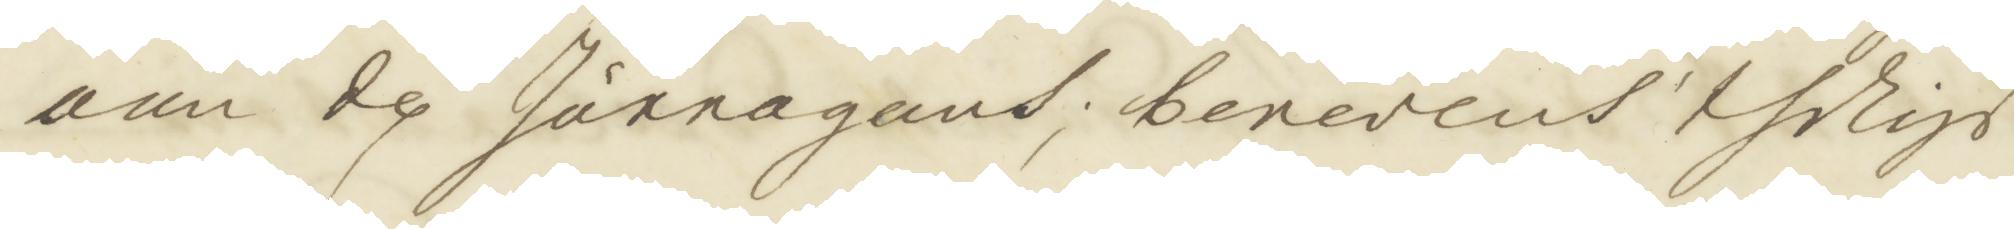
aan de Jurragans; benevens 't schip
